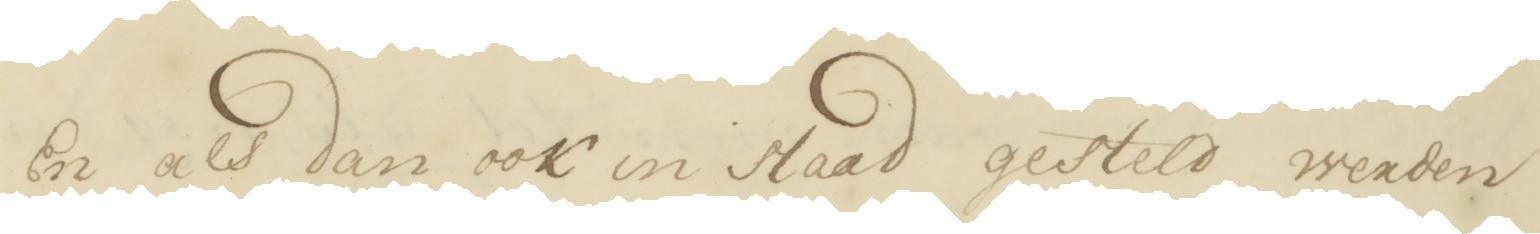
En als dan ook in staad gesteld werden
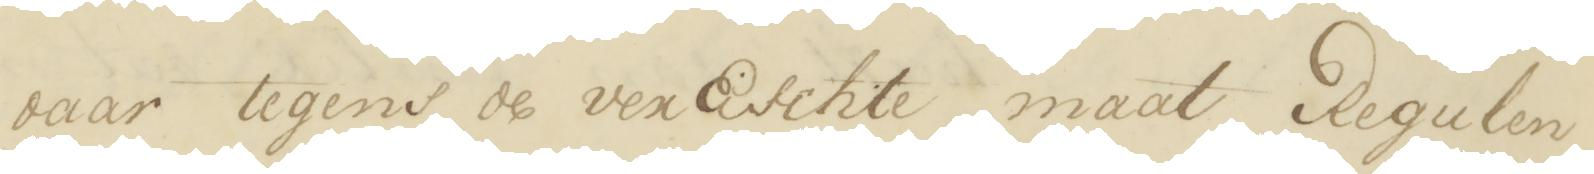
daar tegens de vereischte maat Regulen
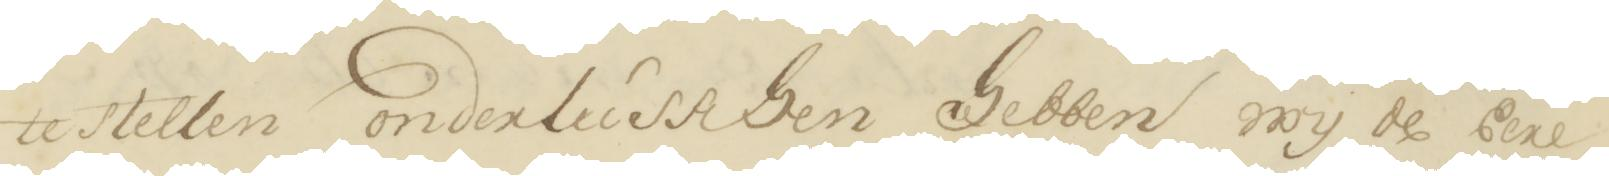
te stellen ondertusschen hebben wij de eere
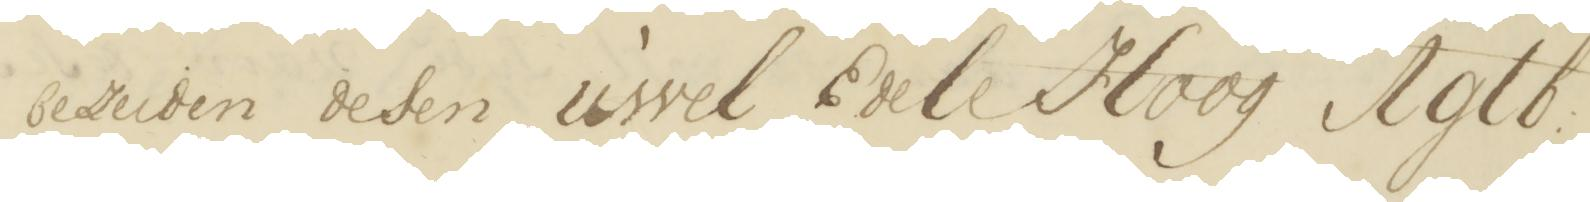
bezeiden desen uwel Edele Hoog Agtb:
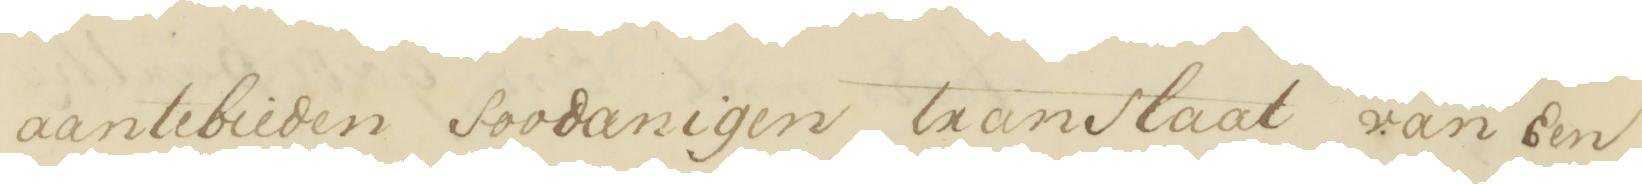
aantebieden soodanigen translaat van een
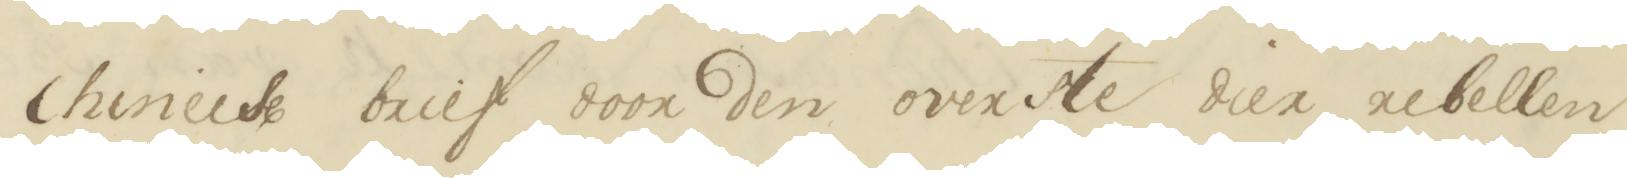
chineese brief door den overste dier rebellen
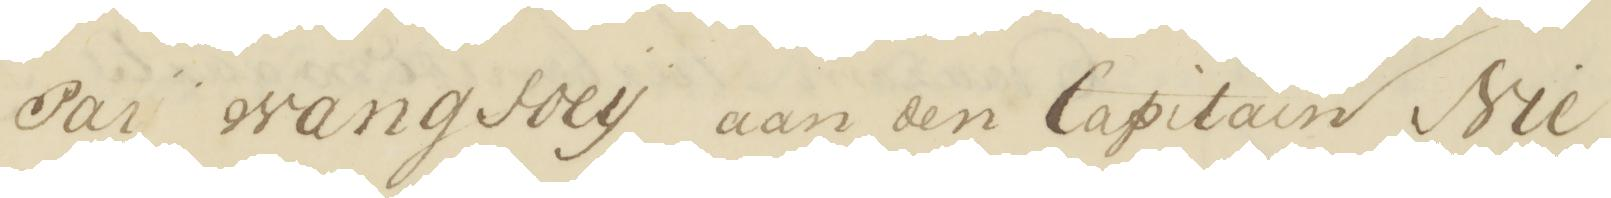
Taij wang soeij aan den Capitain Nie
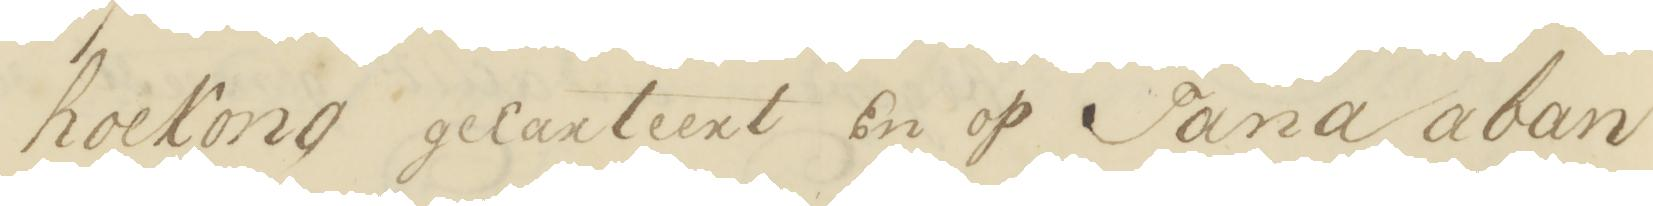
hoekong gecarteert en op Tana aban
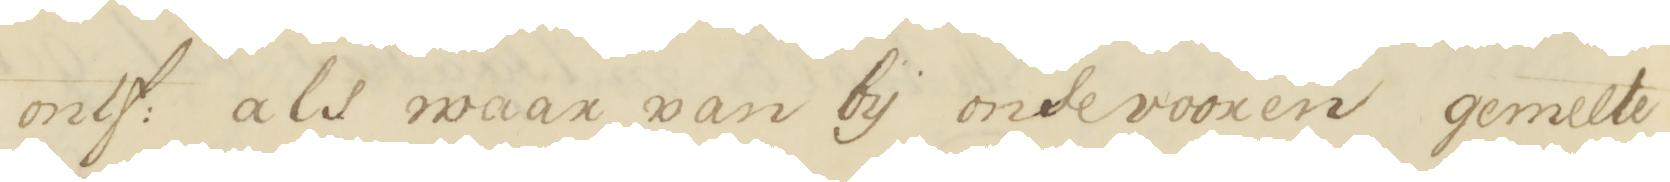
ontf: als waar van bij onse vooren gemelte
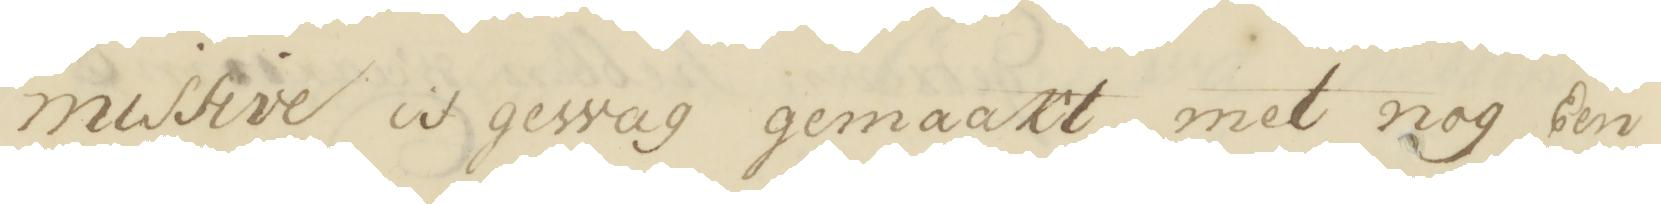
missive is gewag gemaakt met nog een
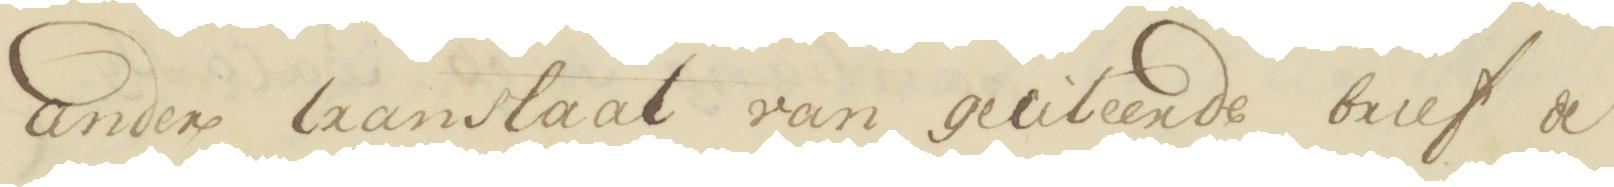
ander translaat van geciteerde brief de
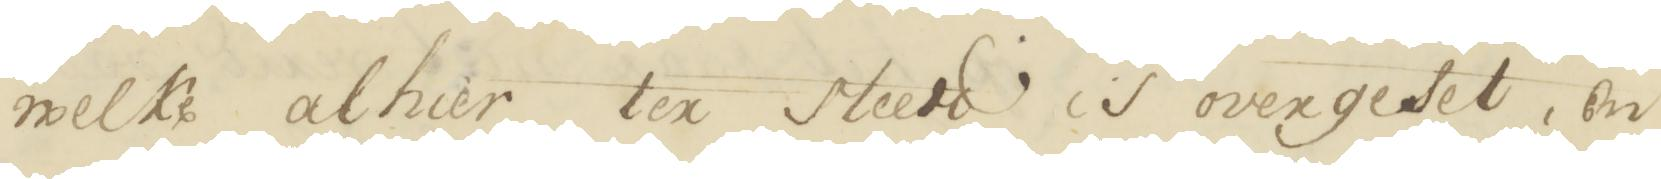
welke alhier ter steede is overgeset, en
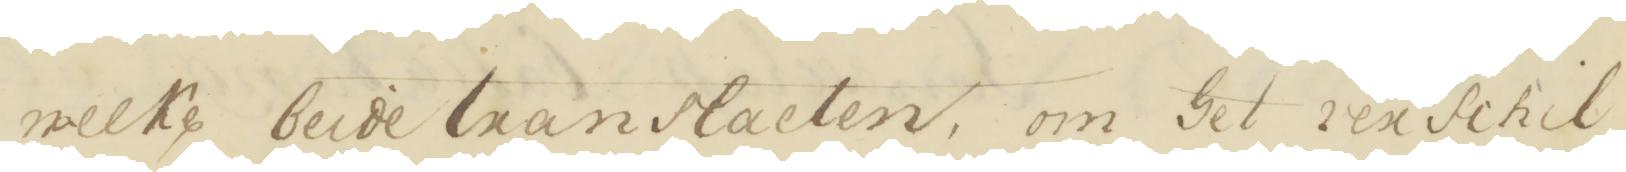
welke beide translaeten, om het verschil
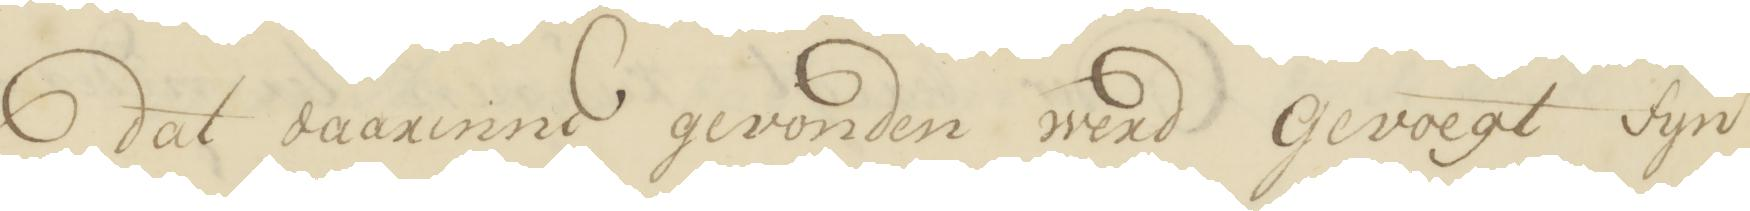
dat daarinne gevonden werd gevoegt sijn
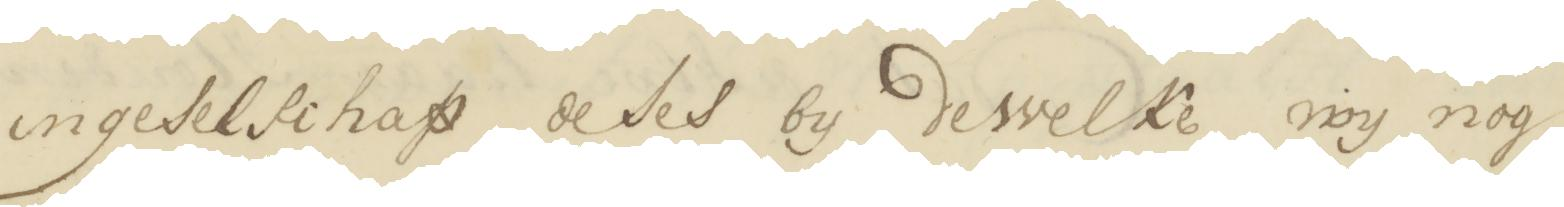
ingeselschap deses by dewelke wy nog
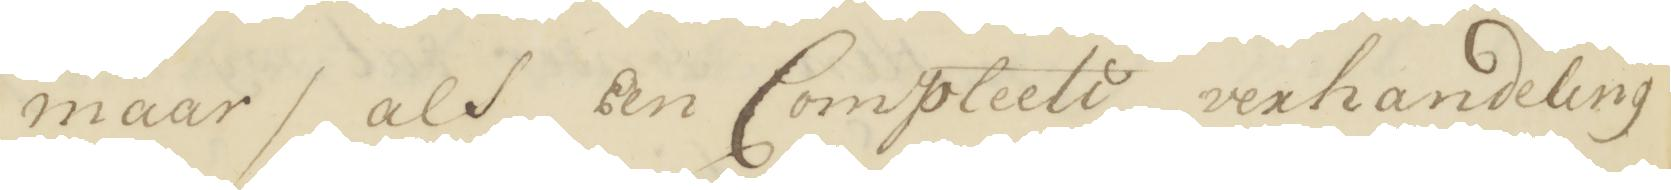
maar / als een Compleete verhandeling
